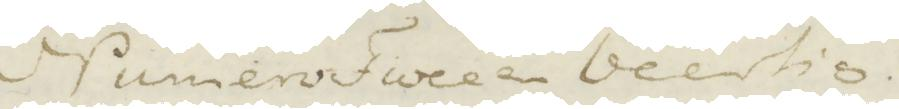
Numero Twee en Veertig
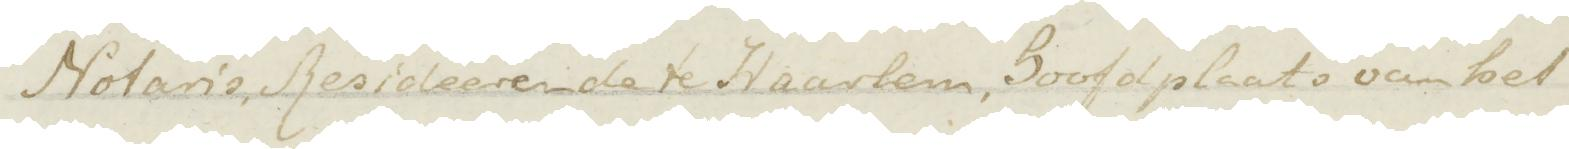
Notaris, Resideerende te Haarlem, hoofdplaats van het
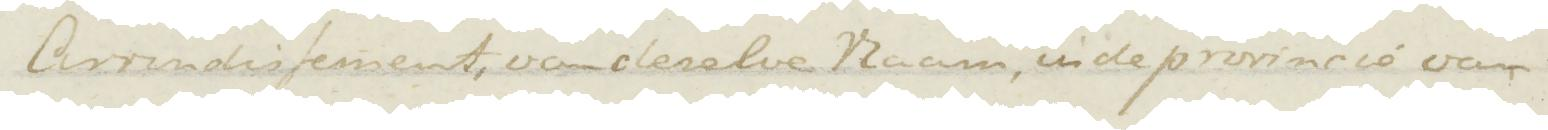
Arrondissement, van deselve Naam, in de provincie van
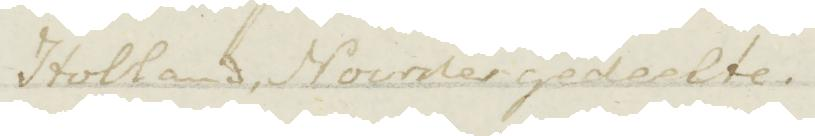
Holland, Noordergedeelte.
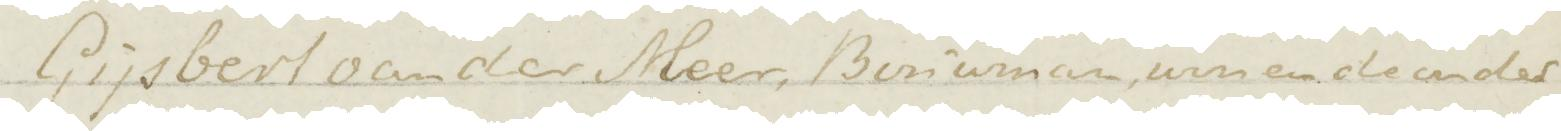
Gijsbert van der Meer, Bouwman, wonende onder
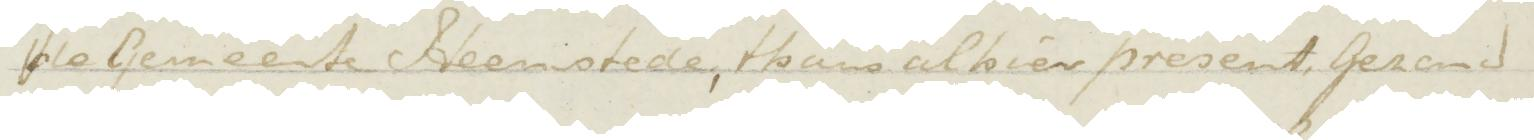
de Gemeente Heemstede, thans alhier present, Gezond
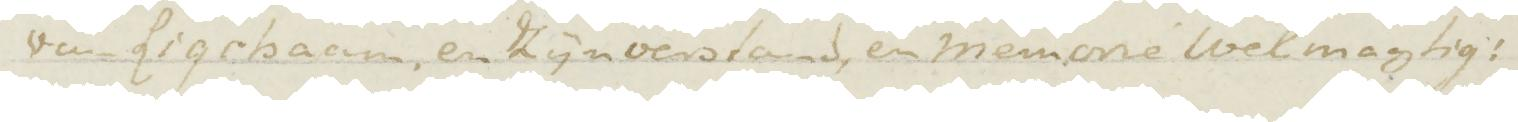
van Ligchaam en Zijn verstand, en memorie welmagtig:
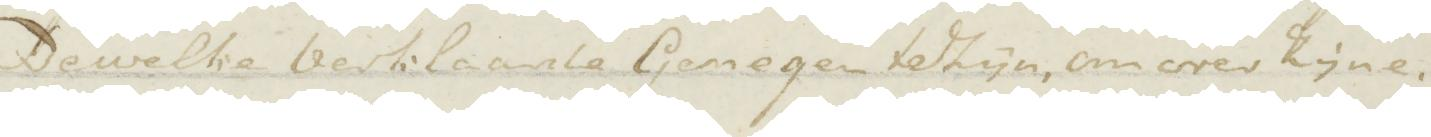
Dewelke verklaarde Genegen te Zijn, om over Zijne,
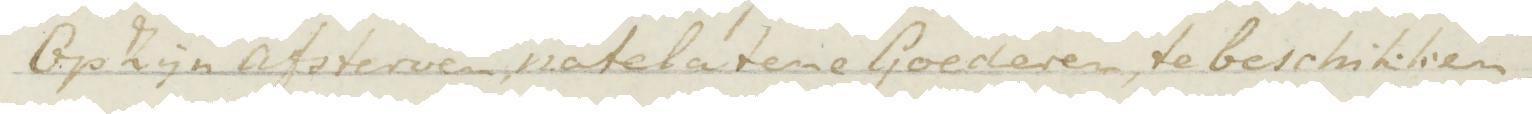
Op Zijn afsterven, natelatene Goederen, te beschikken,
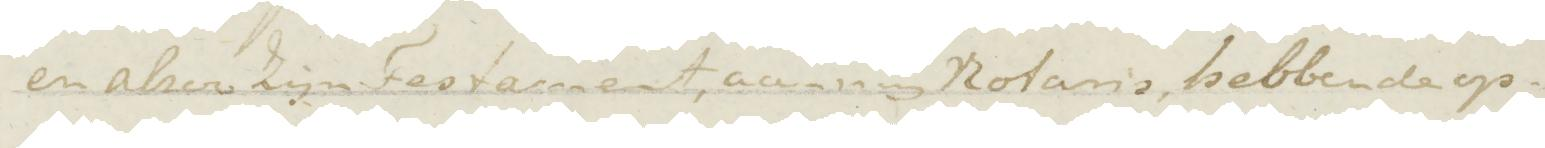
en alzoo Zijn Testament, aan mij Notaris, hebbende op-
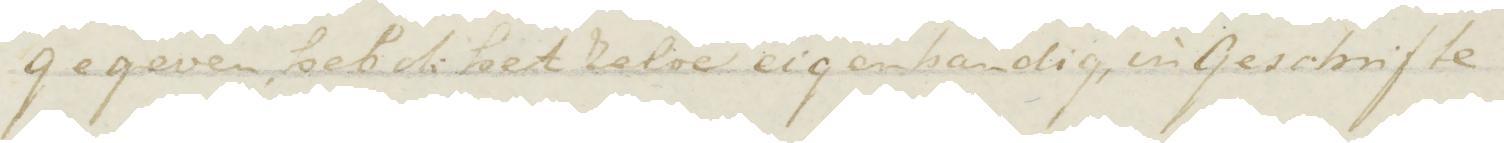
gegeven, heb ik het Zelve eigenhandig, in Geschrifte
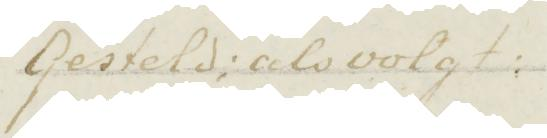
Gesteld; als volgt:
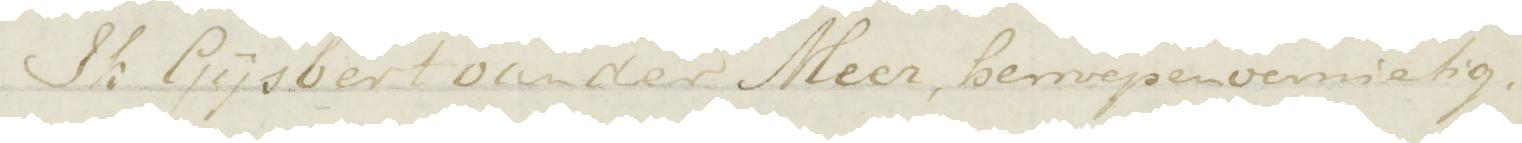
Ik Gijsbert van der Meer, herroep en vernietig,
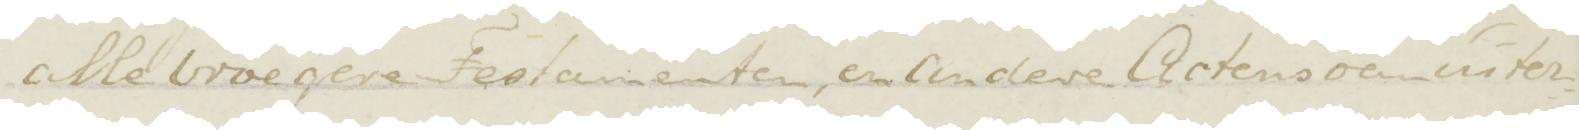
alle vroegere Testamenten, en andere Actens van uiter
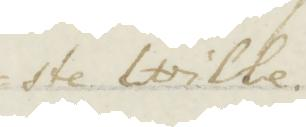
ste Wille
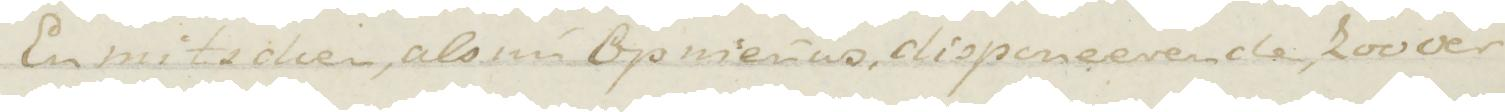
En mitsdien, als nu Opnieuws, disponeerende, Zoo ver
